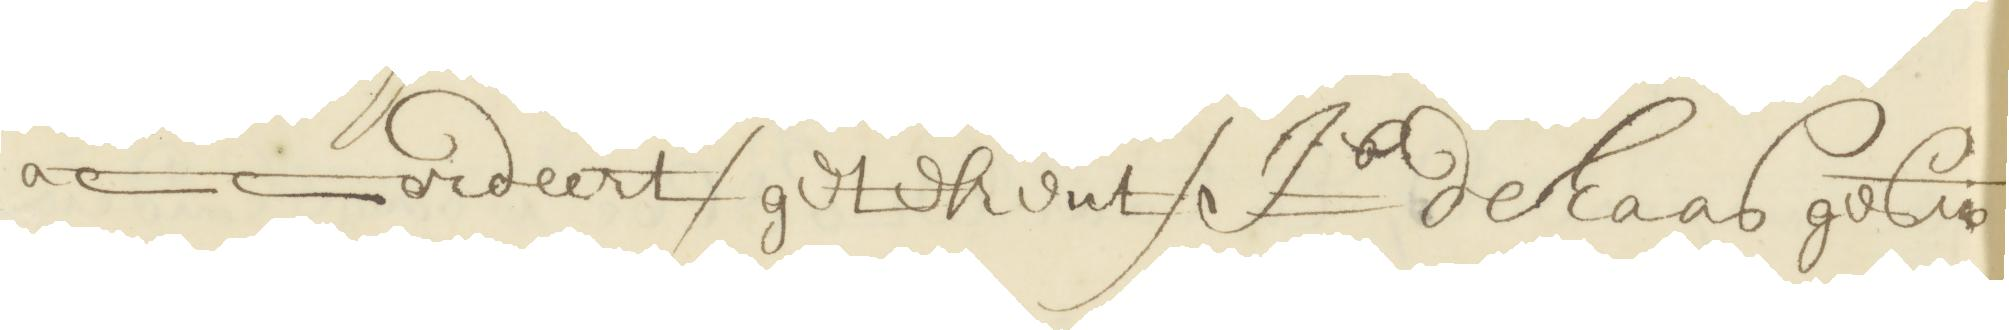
accordeert /getekent/ J=s dehaas gesw
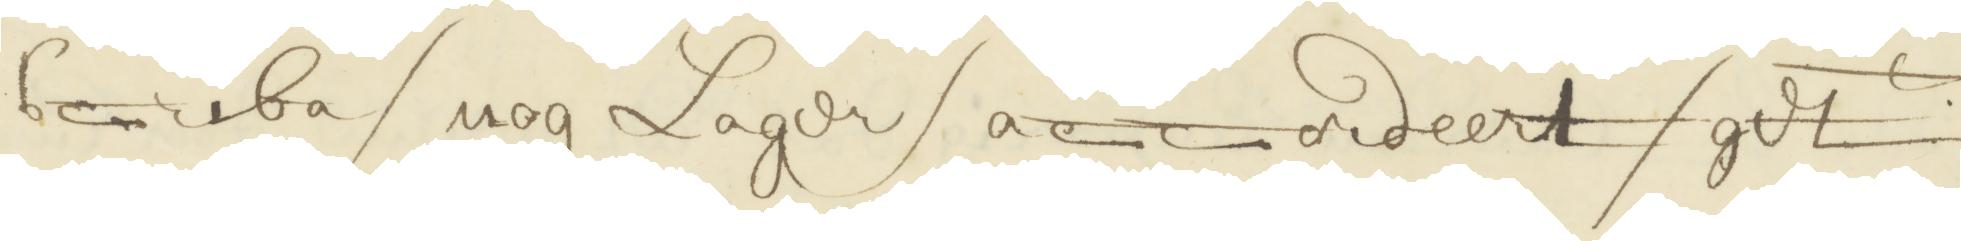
scriba /nog Lager/ accordeert /gett
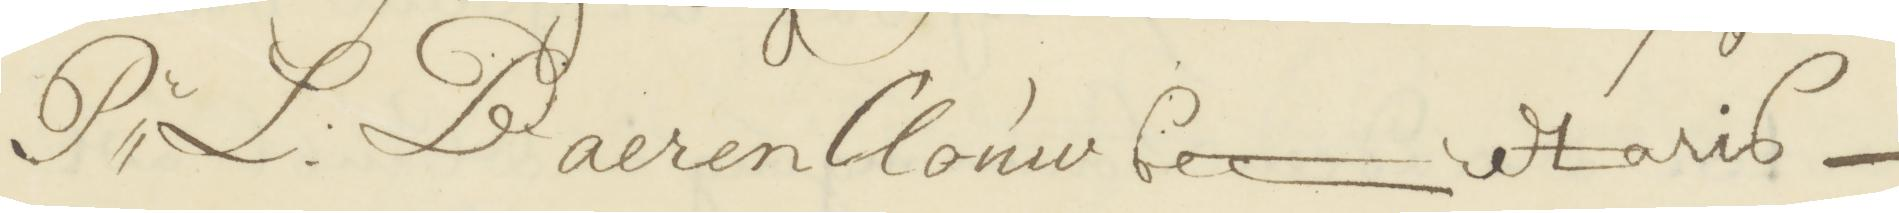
P„r L: Baeren Clouw secretaris —
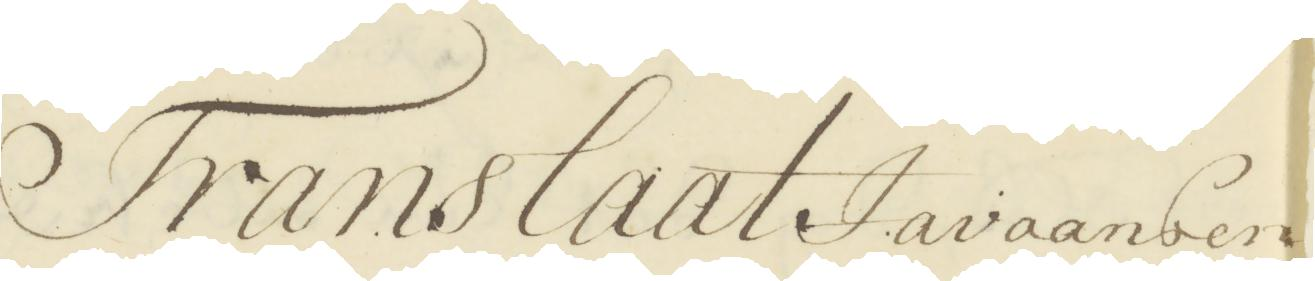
Translaat Iavaansen
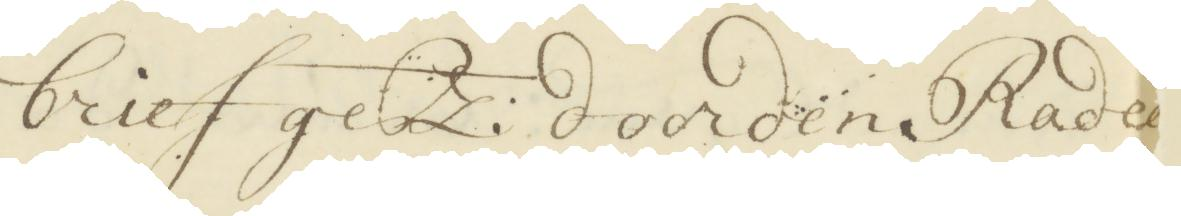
brief gesz: door den Radee
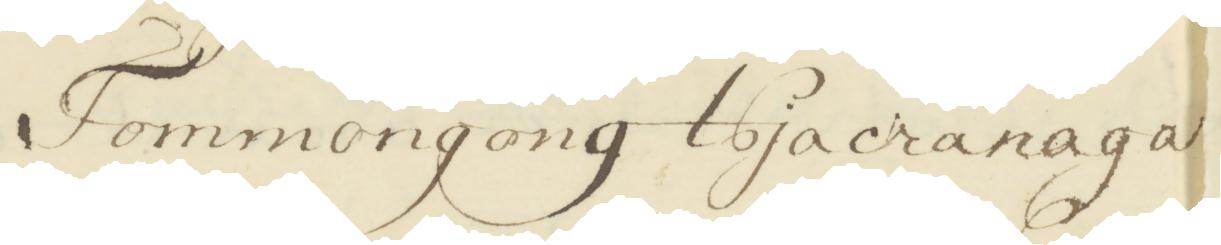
Tommongong tsjacranaga
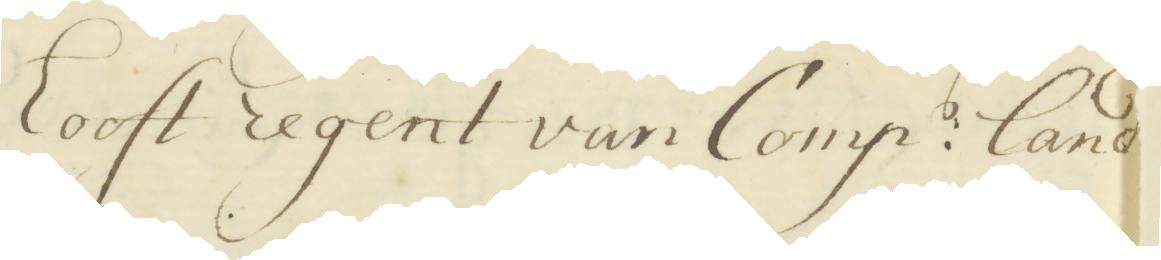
hooft regent van Comp:s land
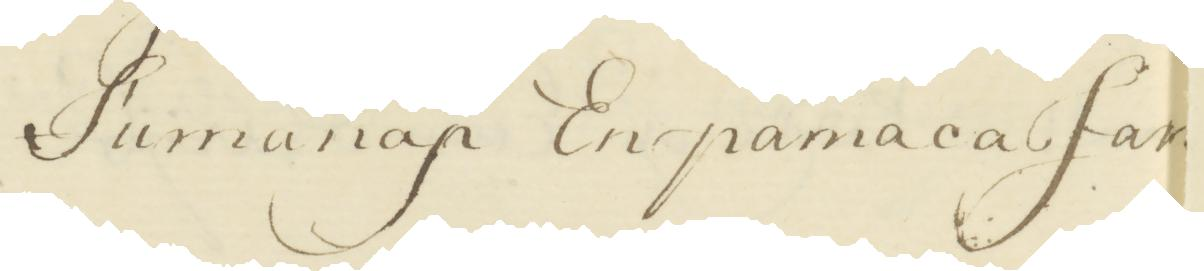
Sumanap En pamacassan
